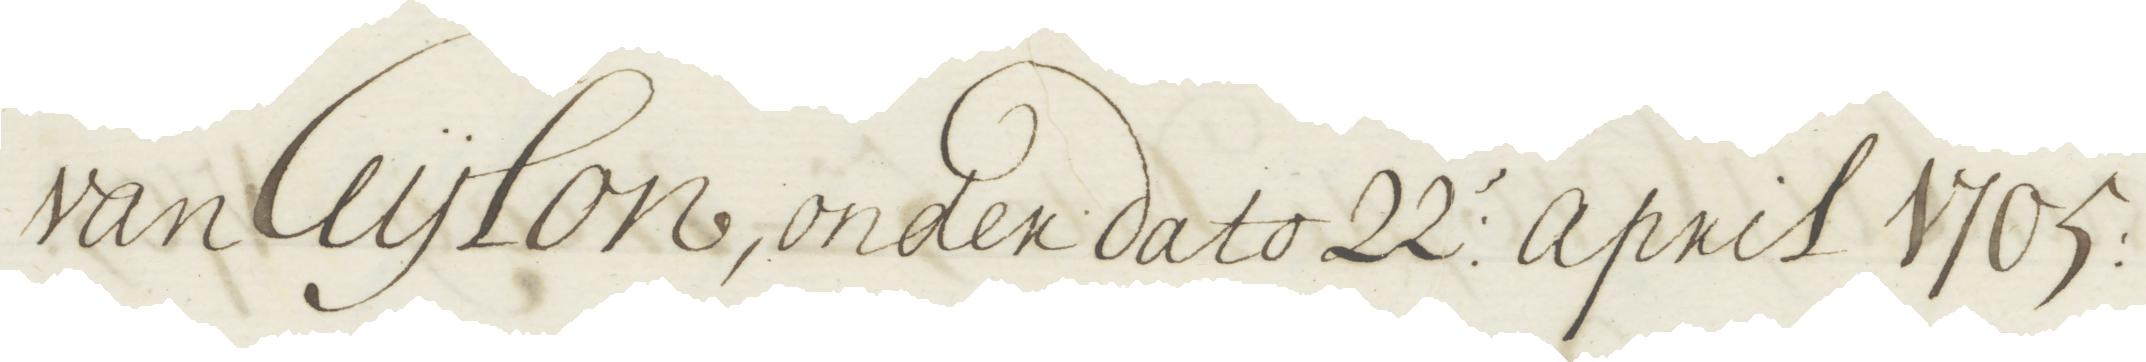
van Ceijlon, onder dato 22:' april 1705:
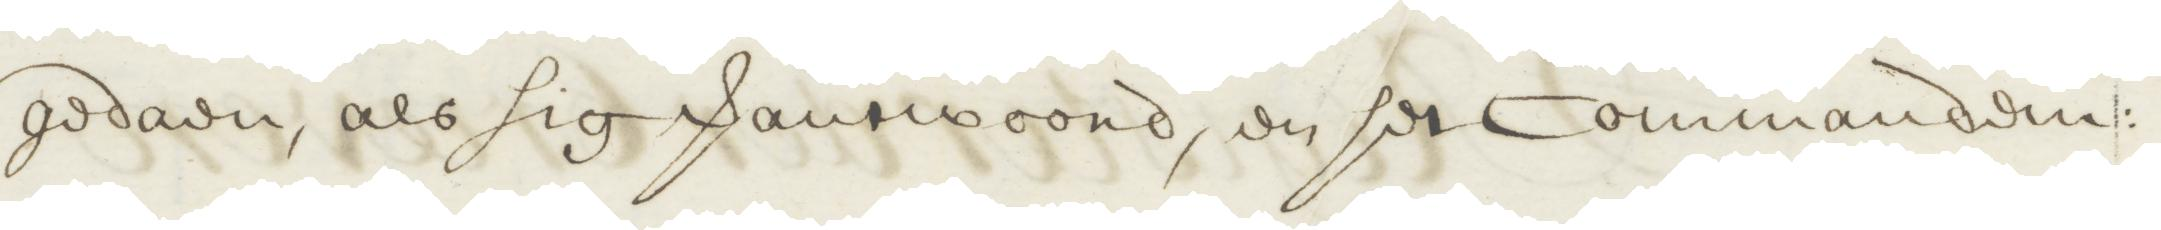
gedaen, als sig verantwoord, en het Commandem:t
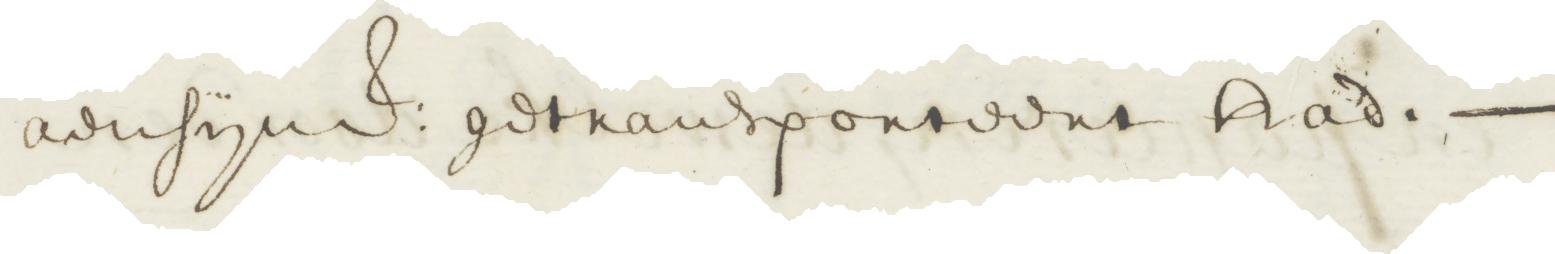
aensijn E: getransporteert had. —
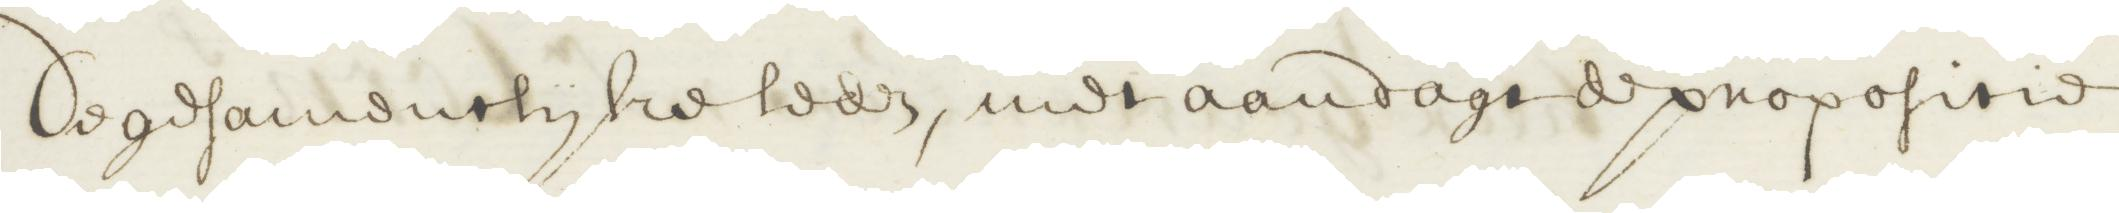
De gesamentlijkeleden, met aandagt depropositie
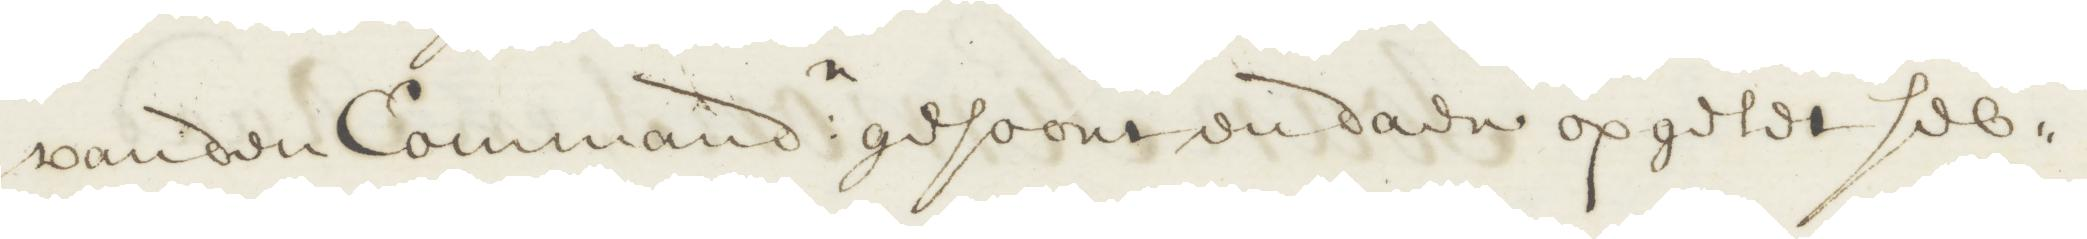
van den Command:r gehoort en daer op gelet heb„
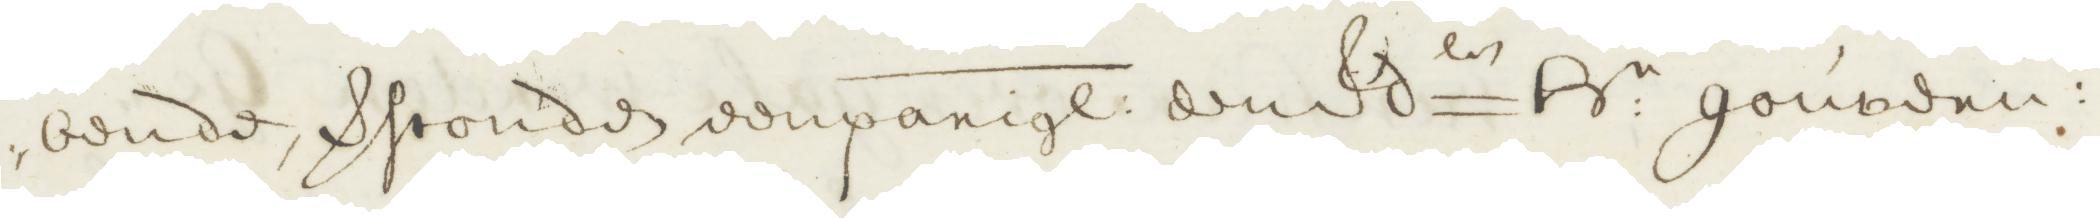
„bende, verstonden eenparigl: denEd=en H:r gouvern:r
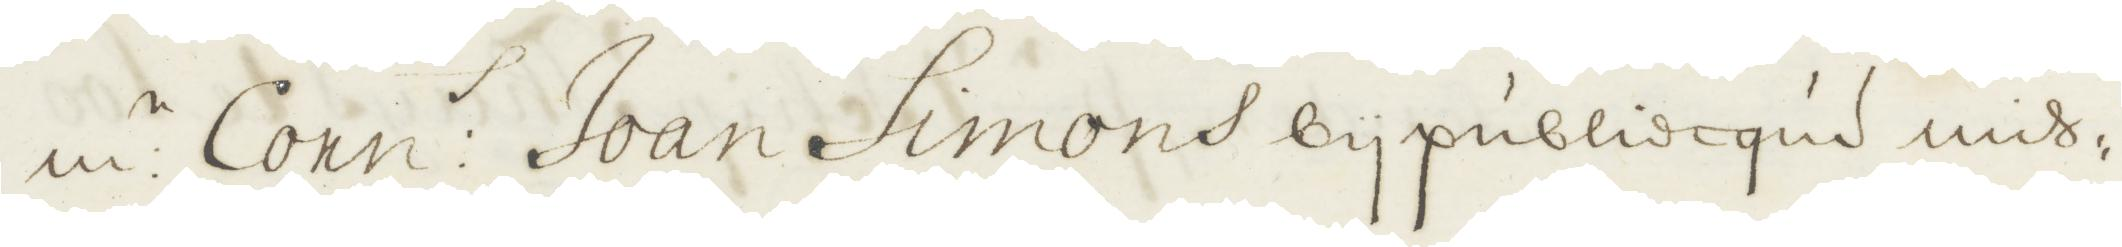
m:r Corn:s Ioan Simons bij publiecque mis„
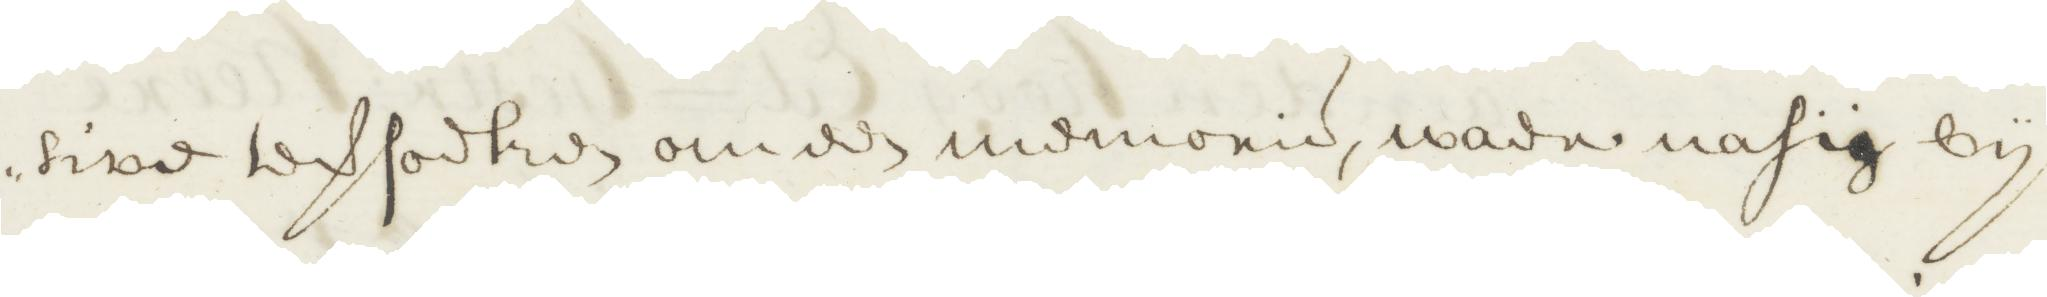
„sive teversoeken om een memorie, waer nasig bij
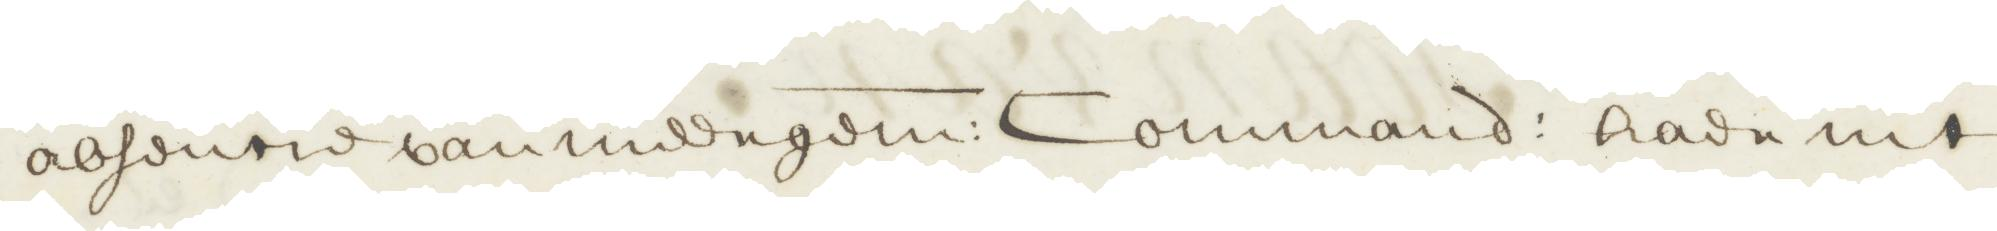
absentie van meer gem: Command:r haer in’t
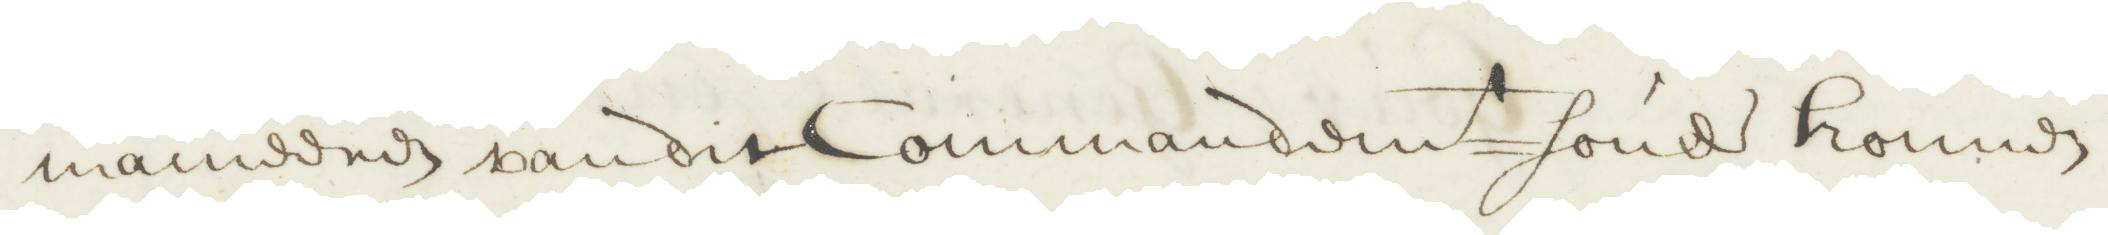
manieren van dit Commandem=te soude konnen
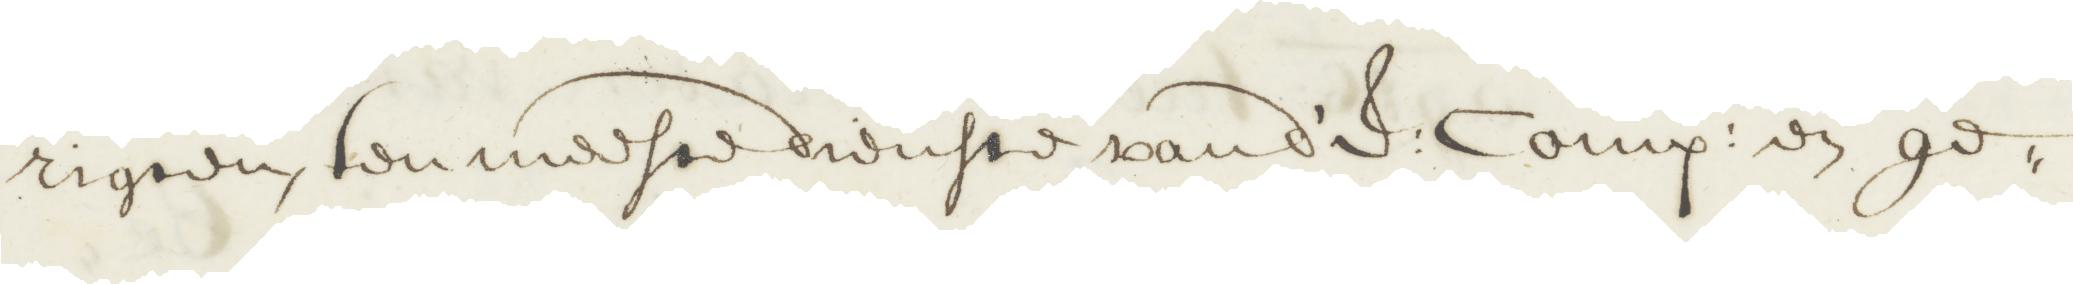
rigten, ten meeste dienste van d’E: Comp:s en ge„
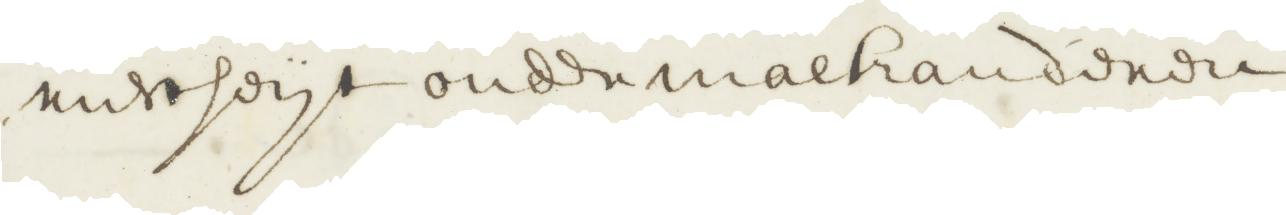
rustheijt onder malkanderen
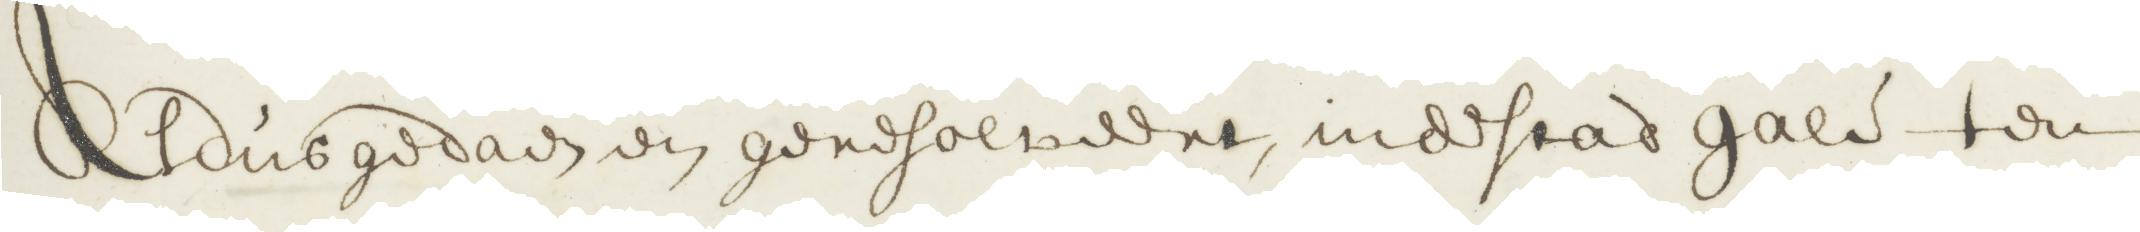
Aldus gedaen en geresolveert, in de stad gale ten
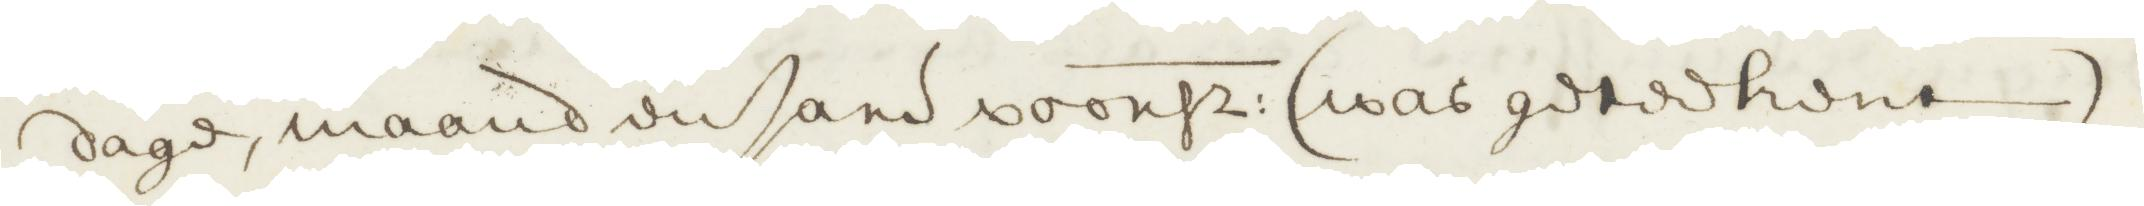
dage, maand enJare voorsz: (was geteekent)
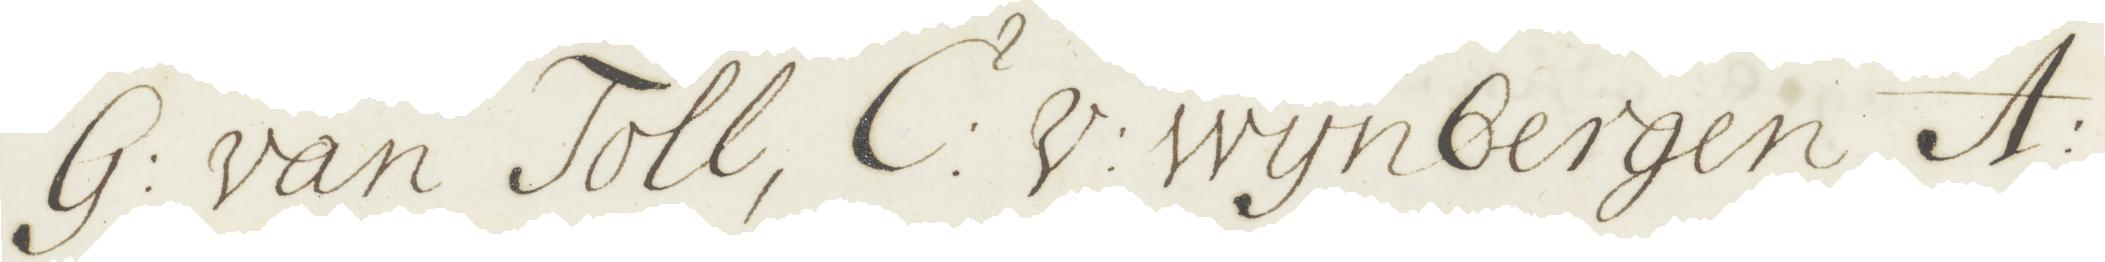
G: van Toll, C: v: wijnbergen, A:
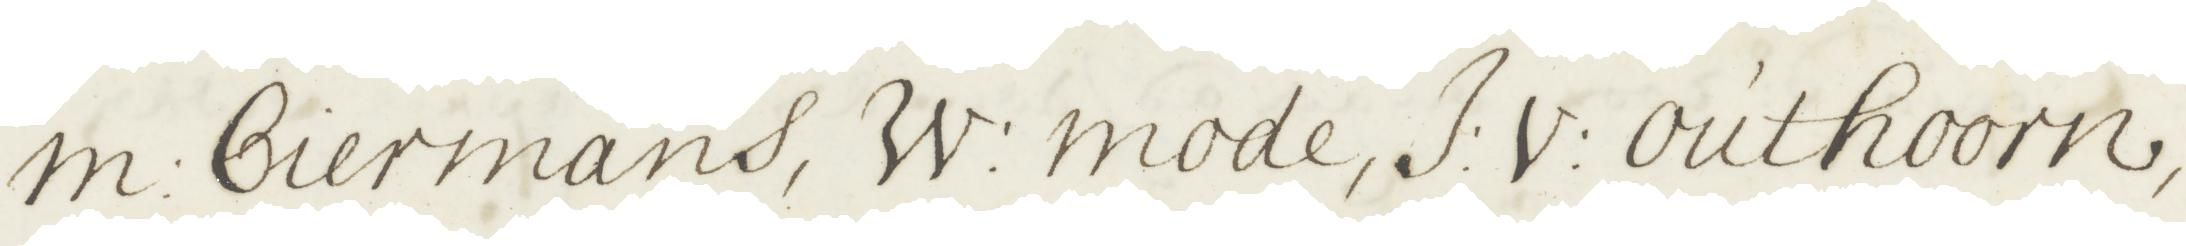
m: biermans, W: mode, J: v: outhoorn,
